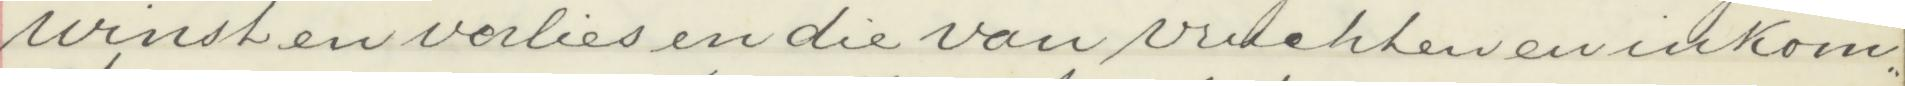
winst en verlies en die van vruchten en inkom„
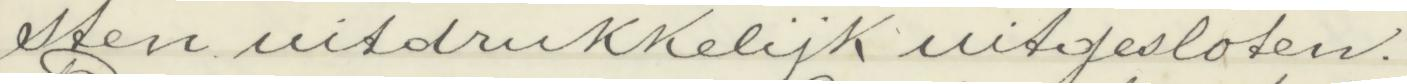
sten uitdrukkelijk uitgesloten.
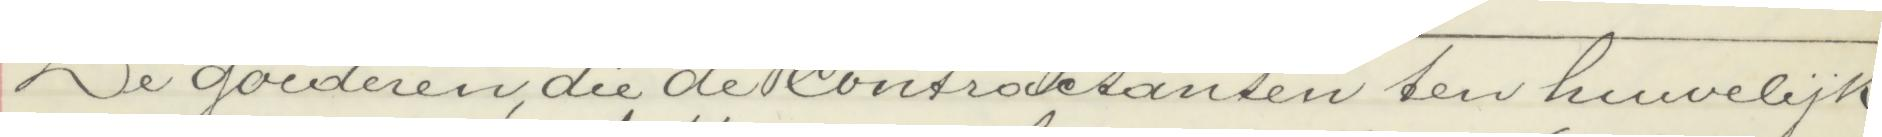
De goederen, die de Contractanten ten huwelijk
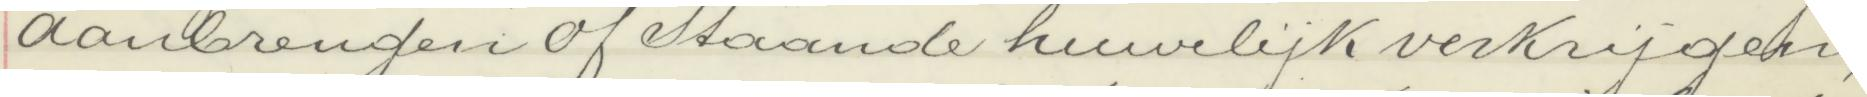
aanbrengen of staande huwelijk verkrijgen,
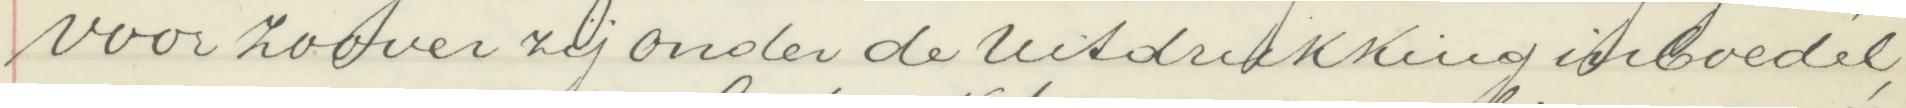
voor zoover zij onder de uitdrukking inboedel,
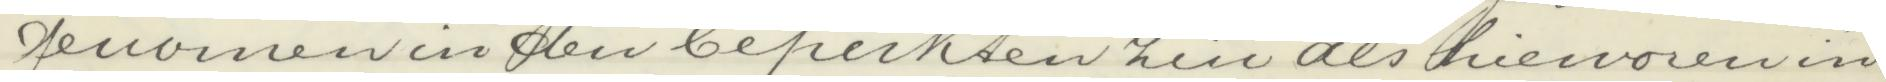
genomen in den beperkten zin als hiervoren in
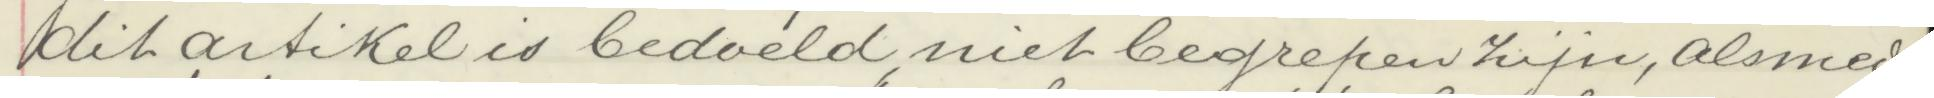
dit artikel is bedoeld, niet begrepen zijn, alsmede
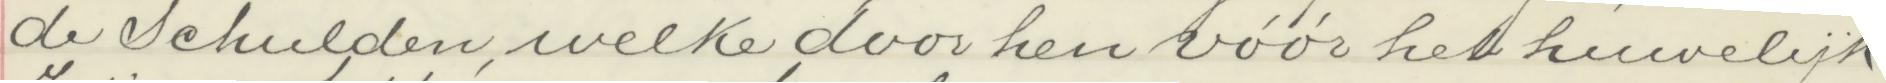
de schulden, welke door hen vóór het huwelijk
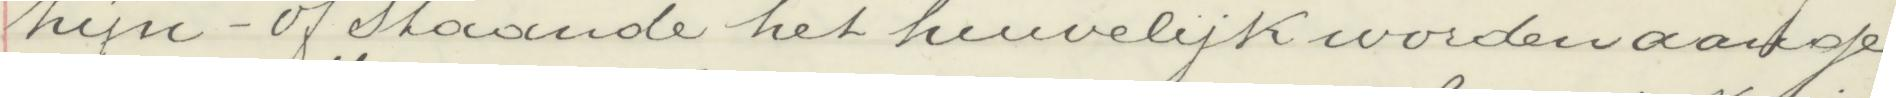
zijn- of staande het huwelijk worden aange
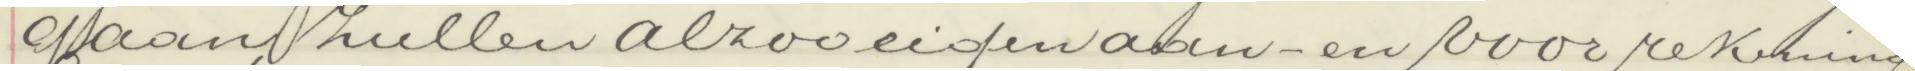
gaan, zullen alzoo eigen aan- en voor rekening
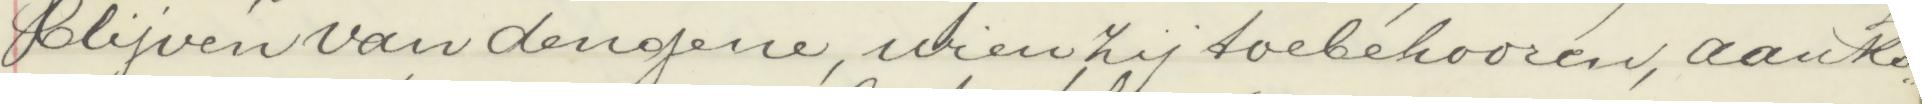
blijven van dengene, wien zij toebehooren, aanko
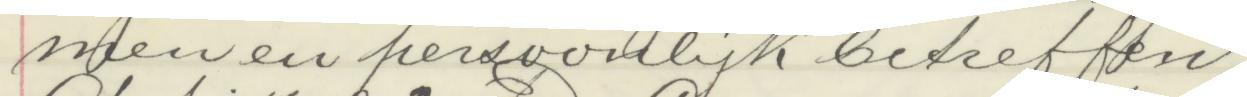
men en persoonlijk betreffen
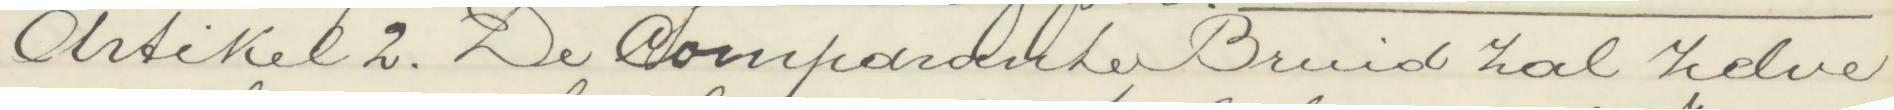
Artikel 2. De Comparante Bruid zal zelve
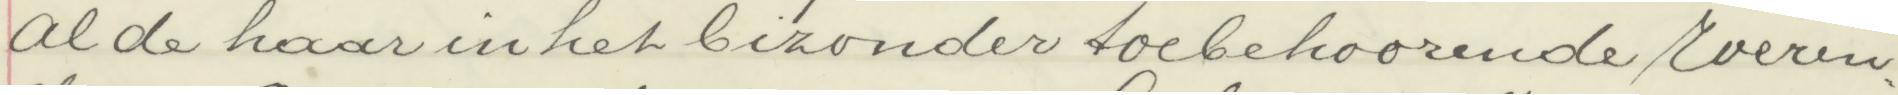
al de haar in het bizonder toebehoorende Roeren„
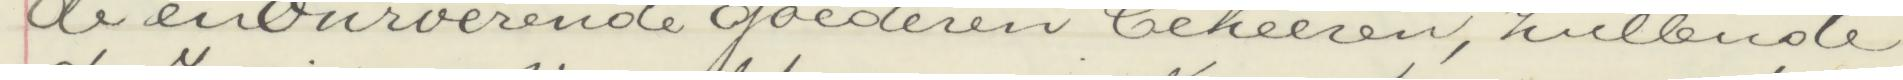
de en Onroerende goederen beheeren, zullende
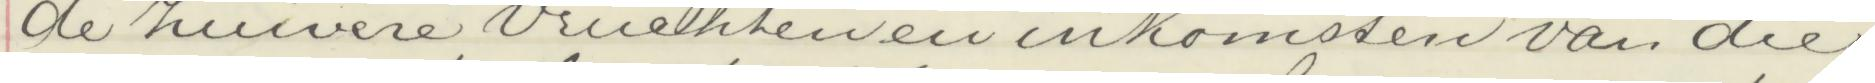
de zuivere vruchten en inkomsten van die
